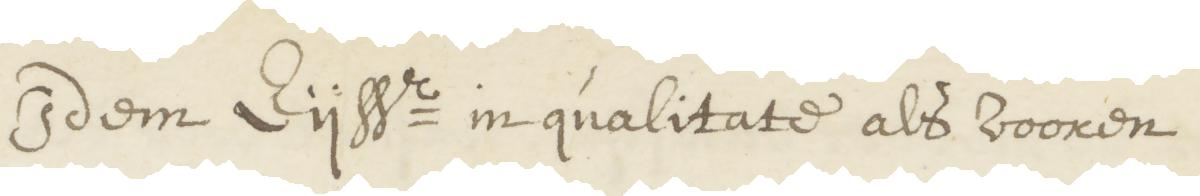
Jdem Eijss=r in qualitate als vooren
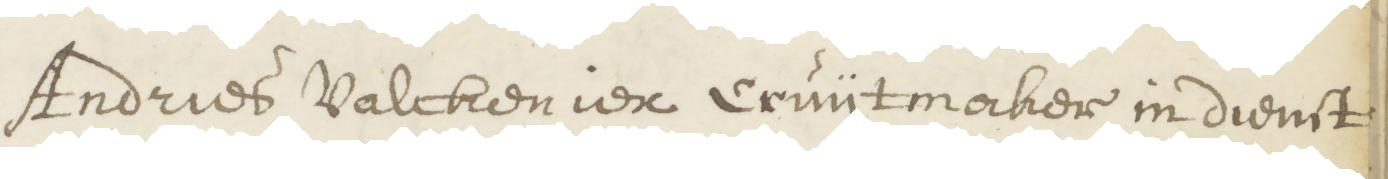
Andries valckenier cruijtmaker in dienst
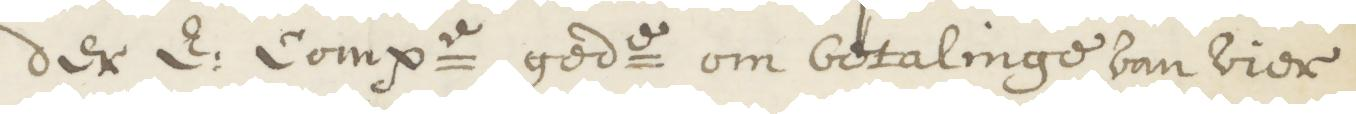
der E: Comp=e ged=e om betalinge van vier
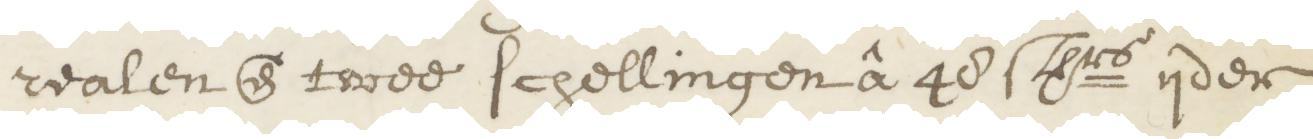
realen en twee schellingen â 48 stver=rs yder
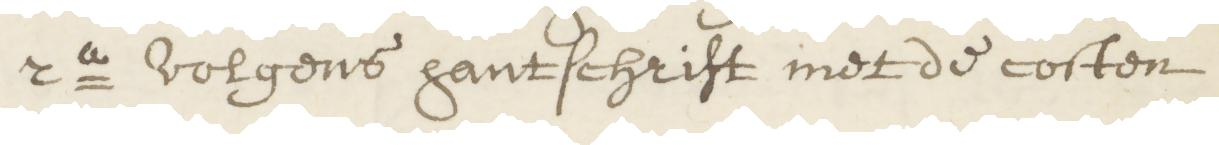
r=a volgens hantschrift met de costen
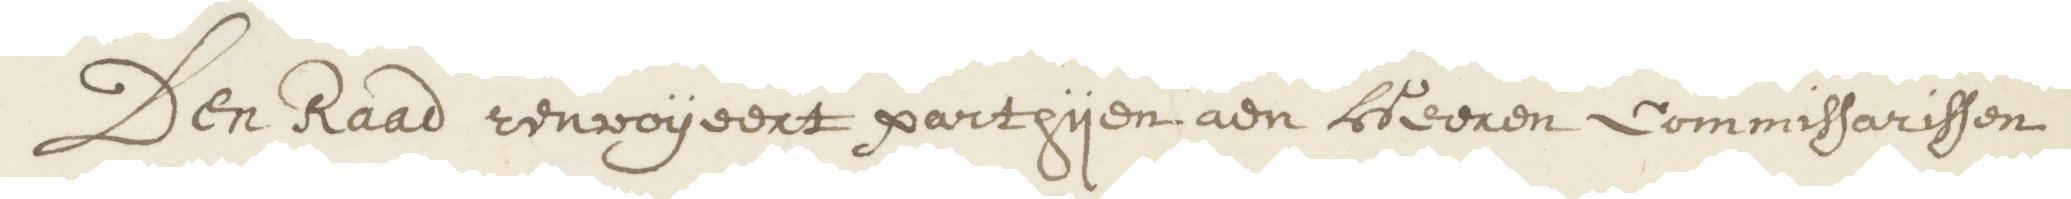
Den Raad renvoijeert parthijen aen Heeren Commissarissen
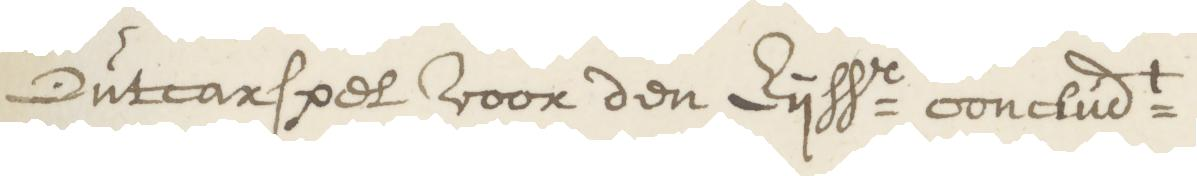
Outcarspel voor den Eijss=r conclud=t
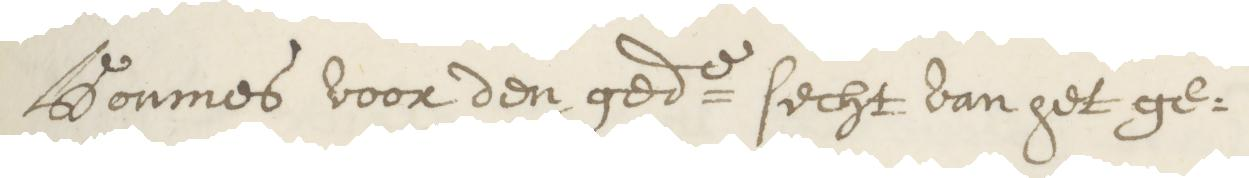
Houmes voor den ged=e secht van het ge=
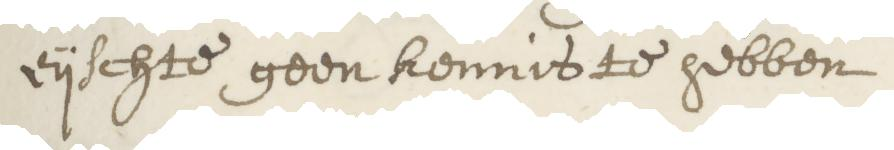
eijschte geen kennis te hebben
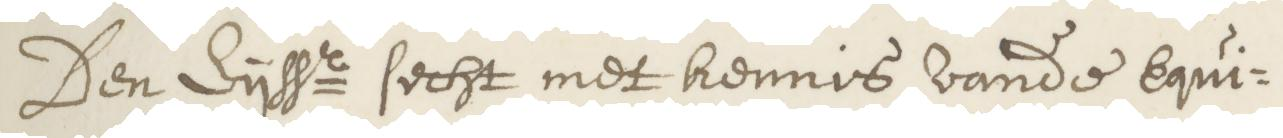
Den Eijss=r secht met kennis vande Equi=
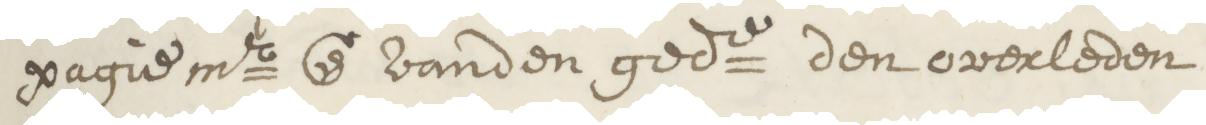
pagie m=r ende van den ged=e den overleden
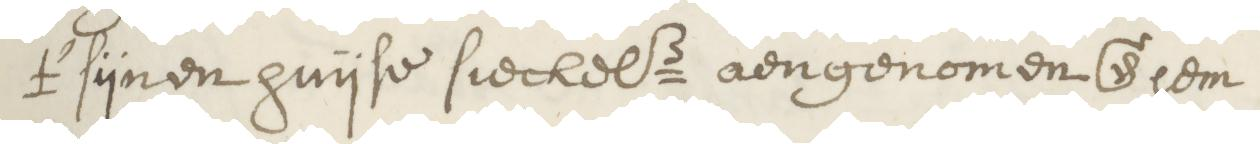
t' sijnen huijse sieckelijk aengenomen ende hem
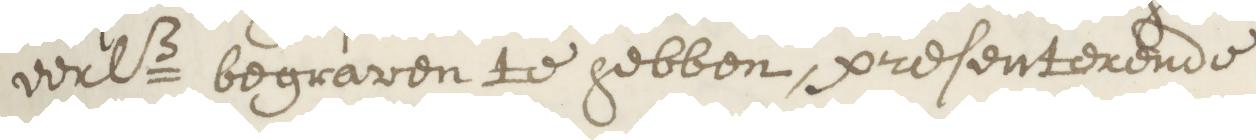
eerlijk begraven te hebben, presenterende
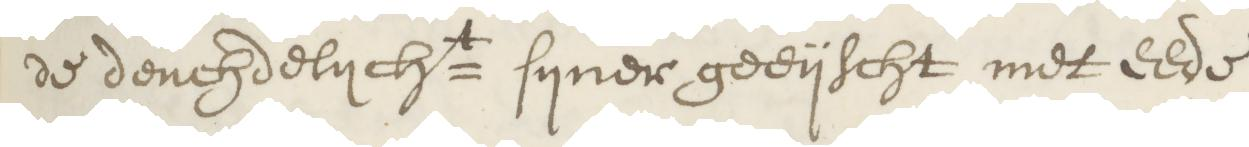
de deuchdelijch=t syner geeijscht met eede
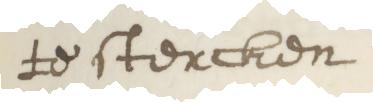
te stercken
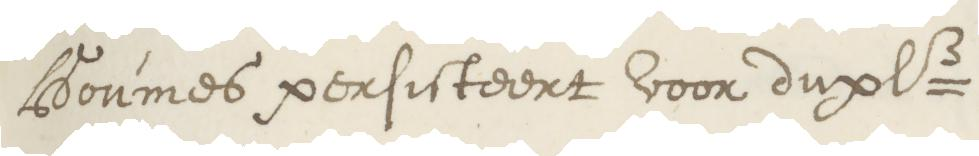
Houmes persisteert voor dupl=
